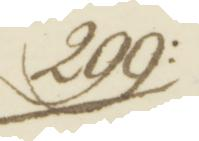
299:
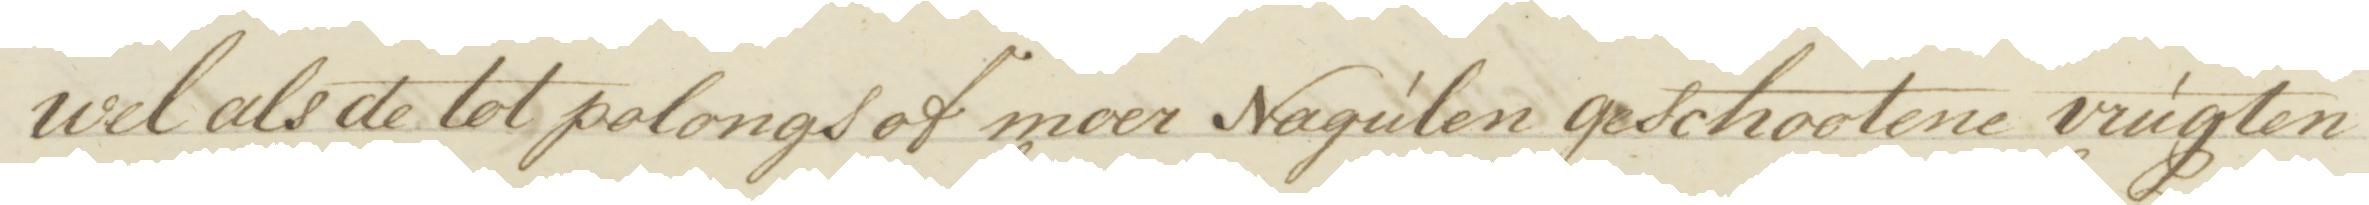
wel als de tot polongs of moer Nagulen geschootene vrugten
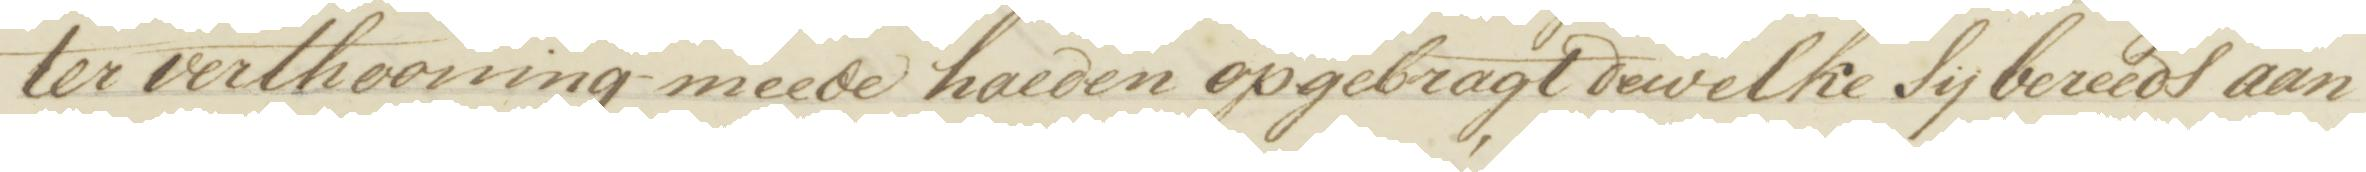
ter verthooning meede haeden opgebragt dewelke Sij bereeds aan
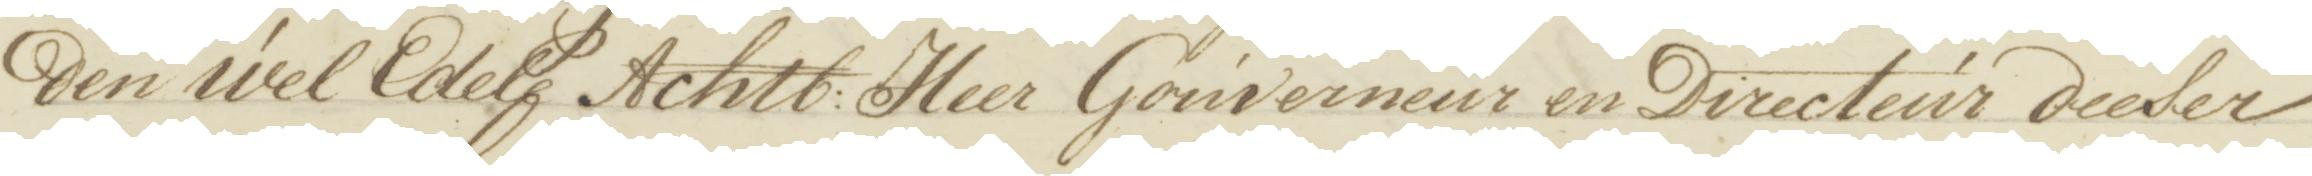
den wel Edele Achtb: Heer Gouverneur en Directeur deeser
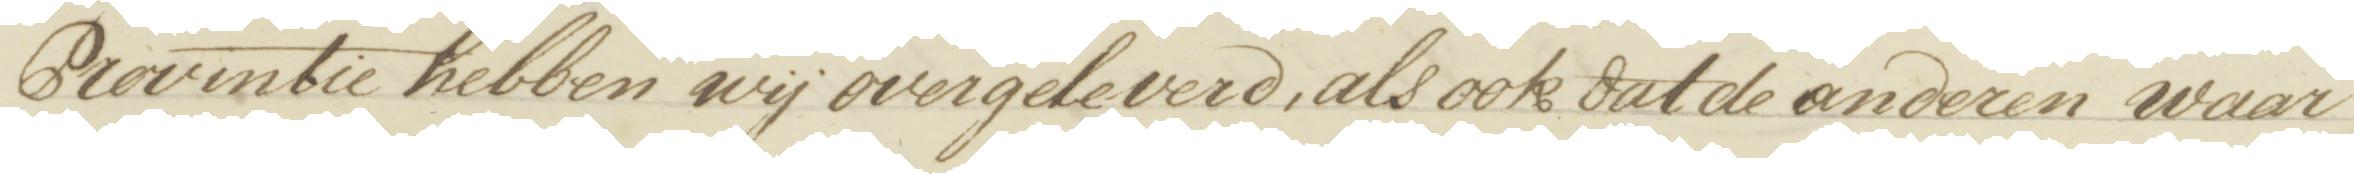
Provintie hebben wij overgeleverd, als ook dat de anderen waar
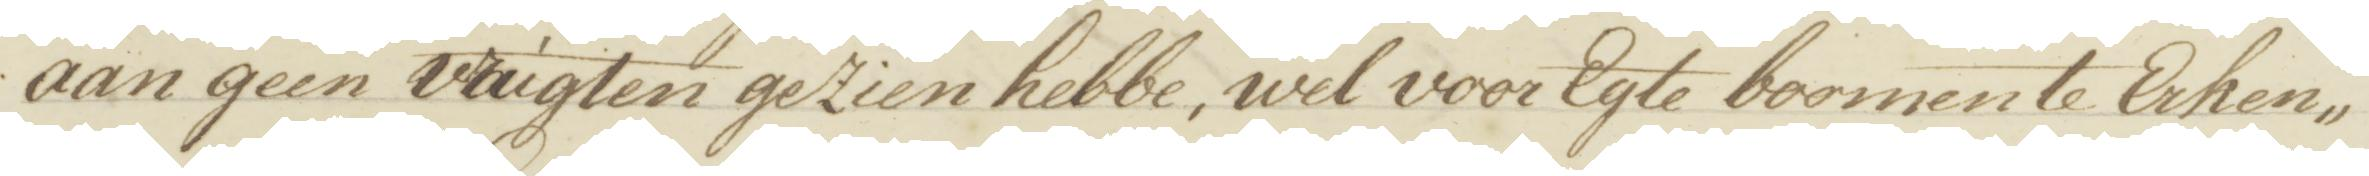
aan geen vrugten gezien hebbe, wel voor Egte boomen te Erken„
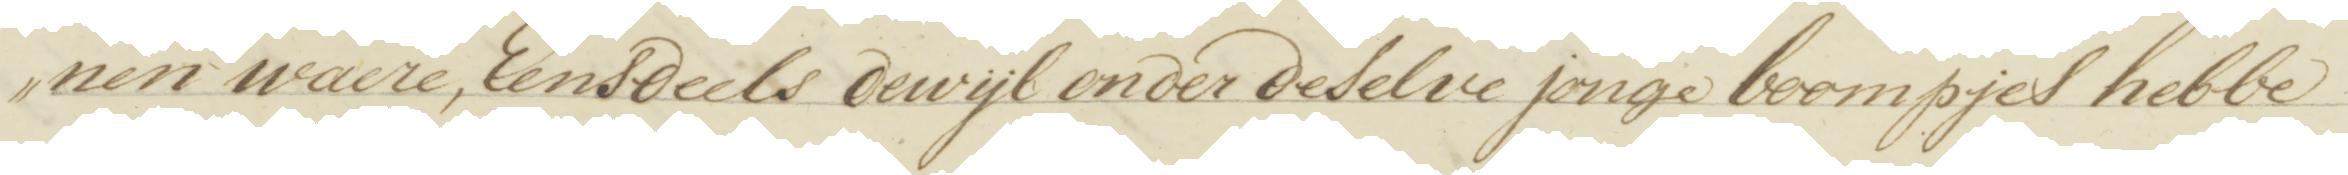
„nen waere, Eensdeels dewijl onder deselve jonge boompjes hebbe
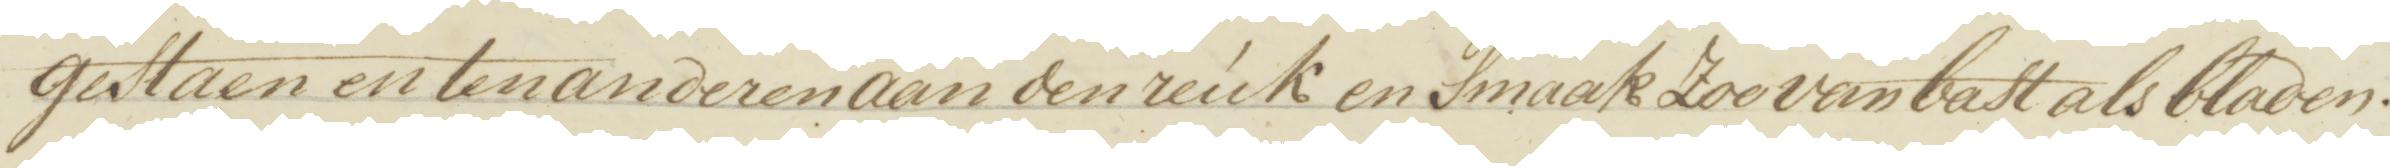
gestaen en ten anderen aan den reuk en Smaak Zoo van bast als bladen.
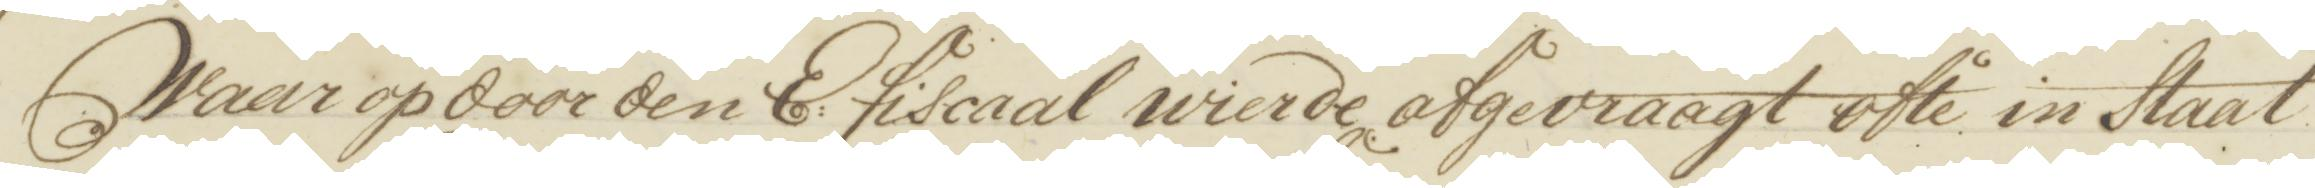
Waar op door den E: fiscaal wierde afgevraagt ofte in Staat
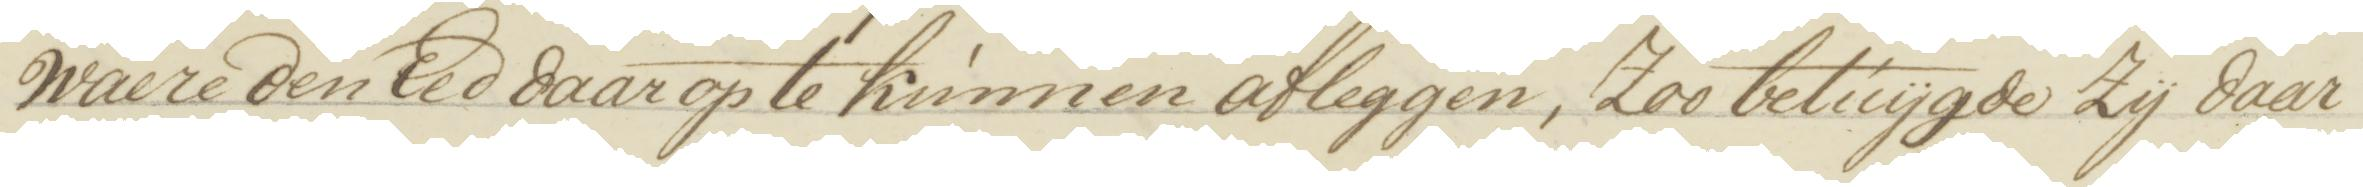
waere den Eed daar op te kunnen afleggen, zoo betuijgde Zij daar
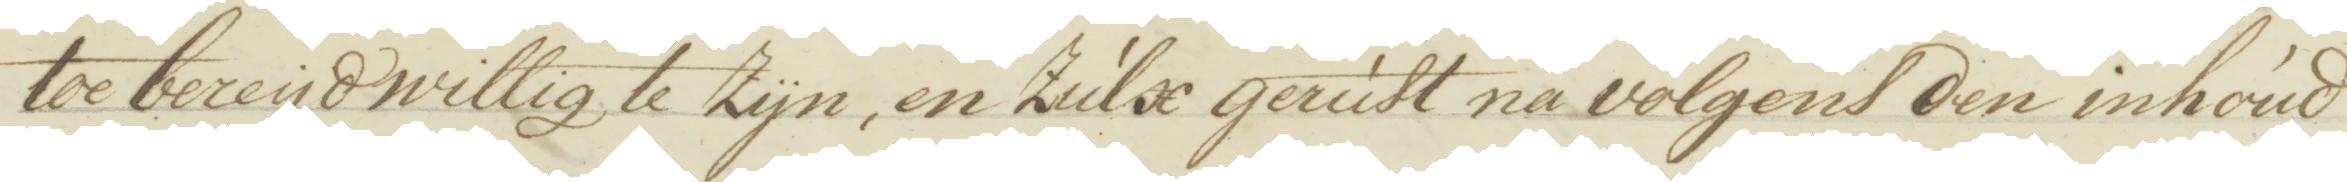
toe bereijd willig te Zijn, en Zulx gerust na volgens den inhoud
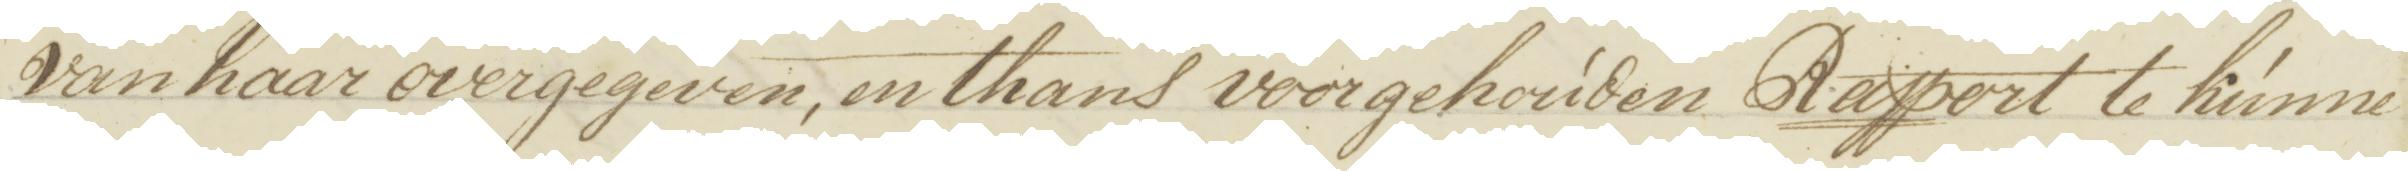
van haar overgegeven, en thans voorgehouden Rapport te kunne
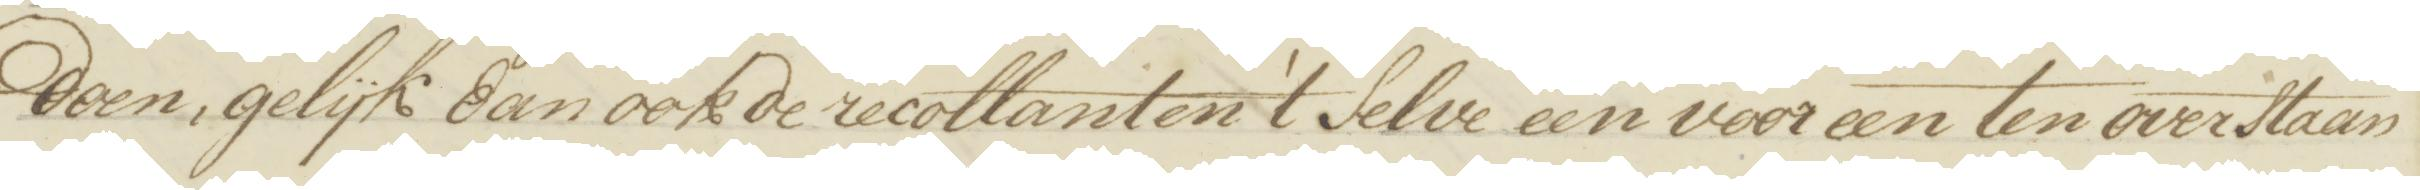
doen, gelijk dan ook de recollanten ’t Selve een voor een ten overstaan
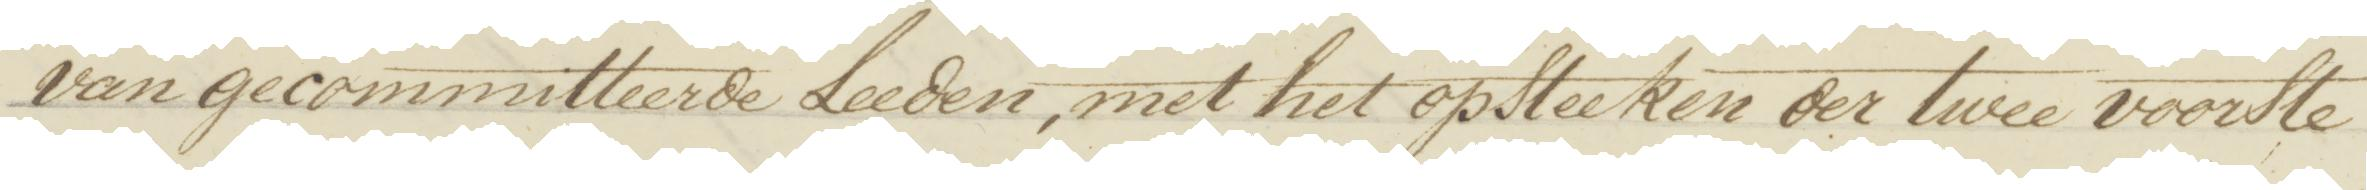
van gecommitteerde Leeden, met het opsteeken der twee voorste
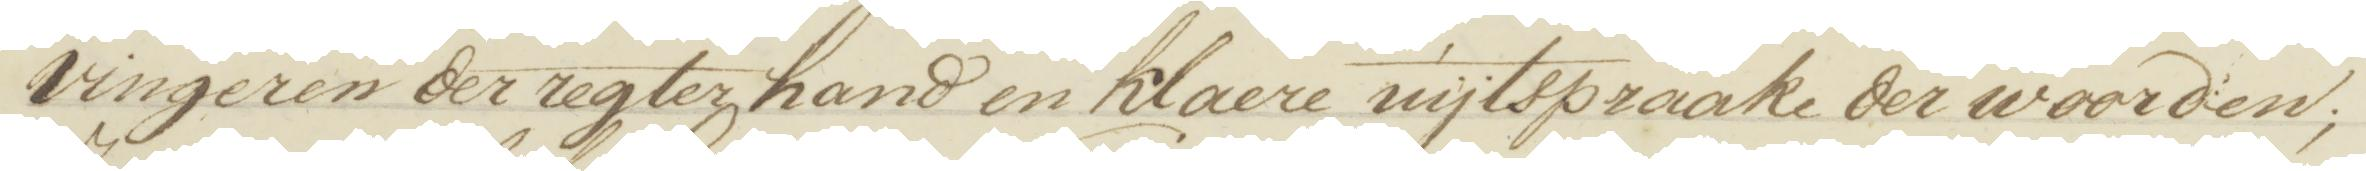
vingeren der regter hand en klaere uijtspraake der woorden;
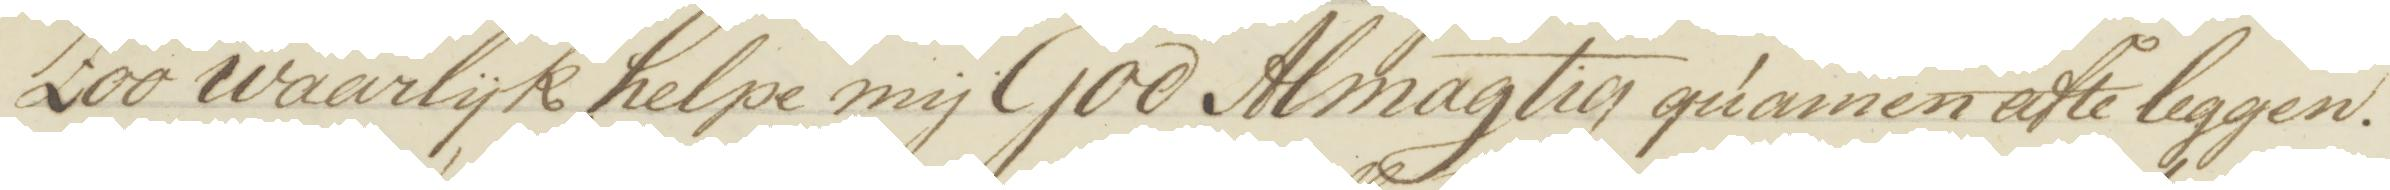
Zoo waarlijk helpe mij God Almagtig quamen af te leggen.
